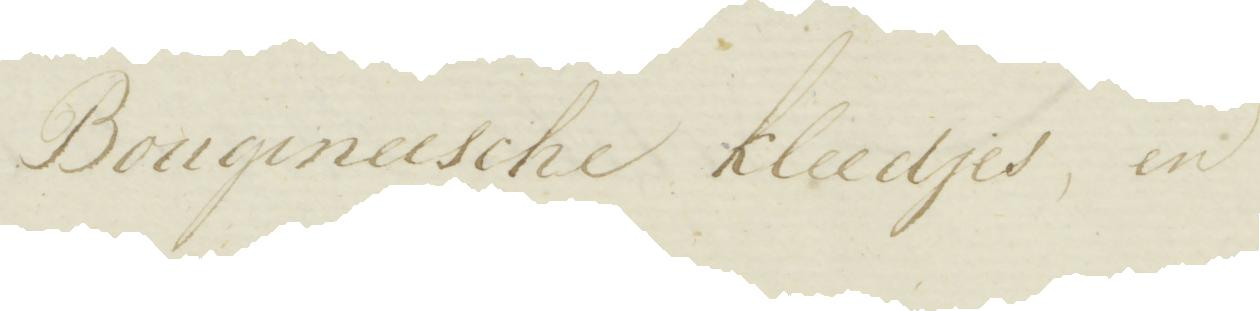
Bougineesche kleedjes, en
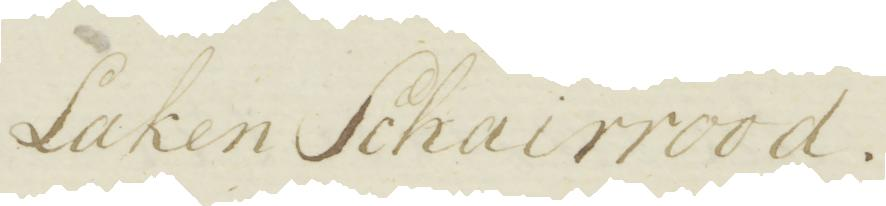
Laken Schairrood.
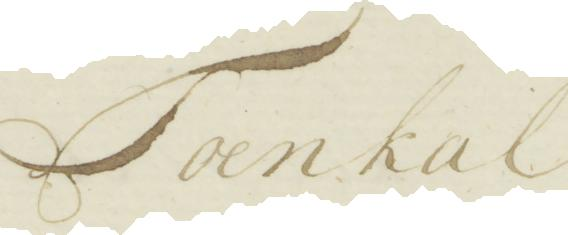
Toenkal
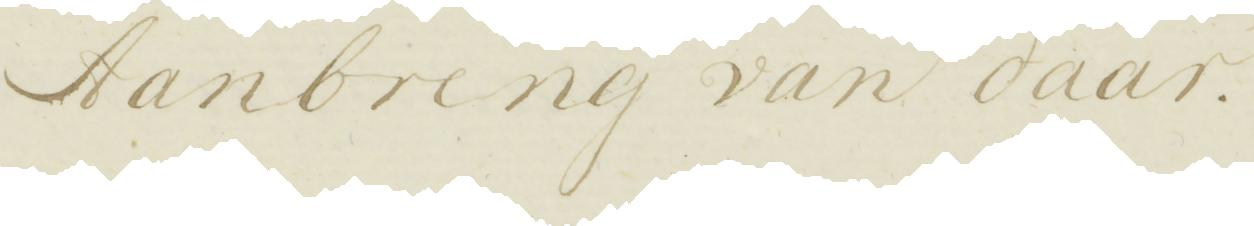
Aanbreng van daar.
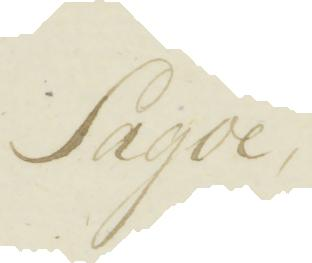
Sagoe,
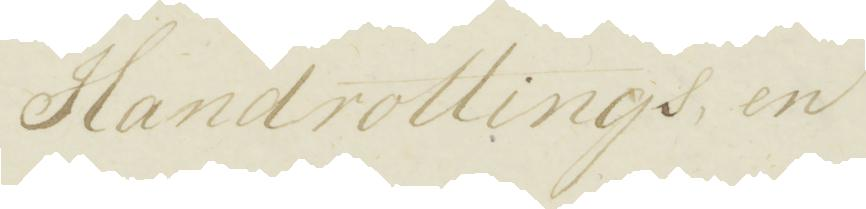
Handrottings, en
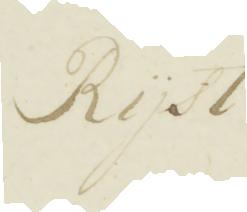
Rijst
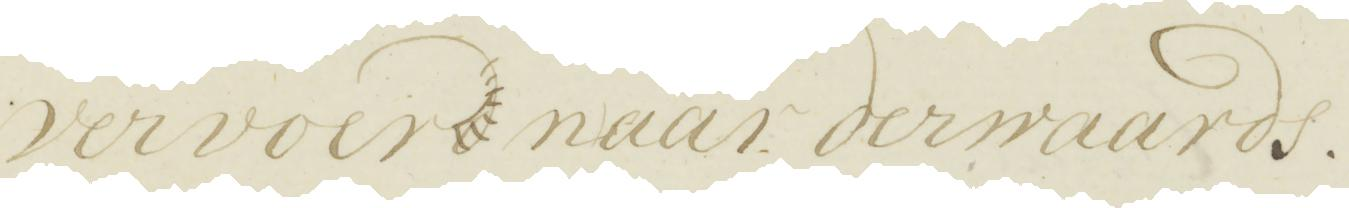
vervoerd naar derwaards.
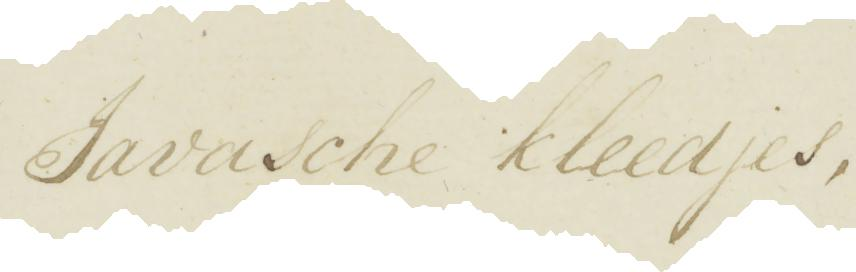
Javasche kleedjes,
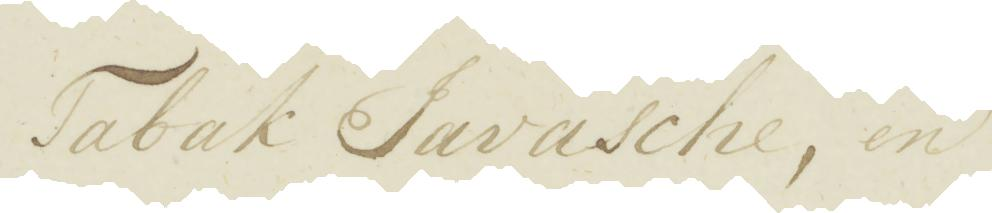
Tabak Javasche, en
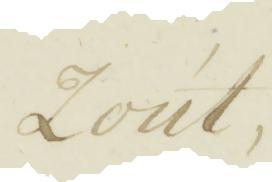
Zout,
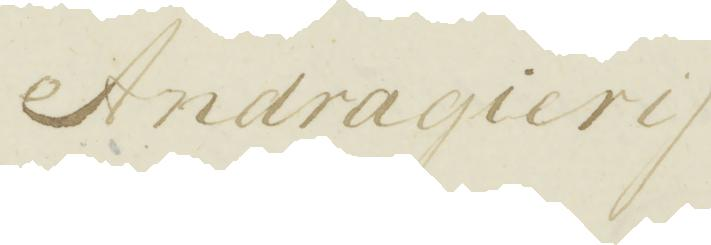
Andragierij
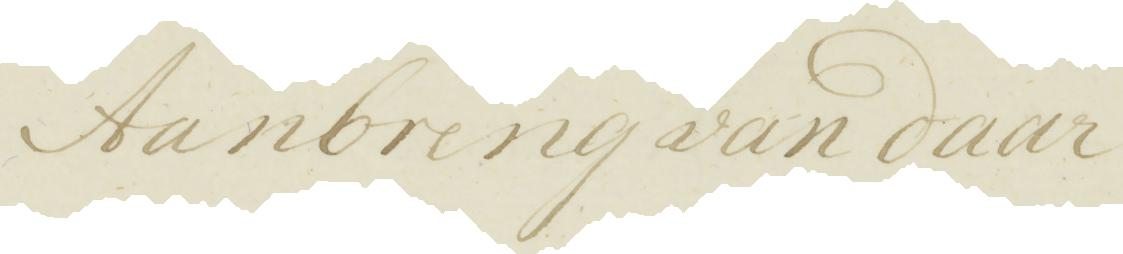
Aanbreng van daar
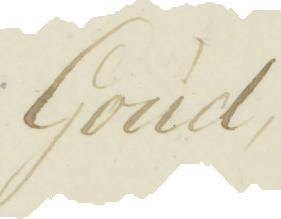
Goud,
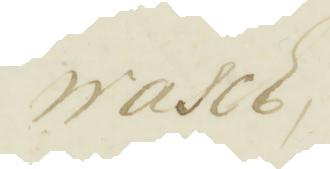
wasch,
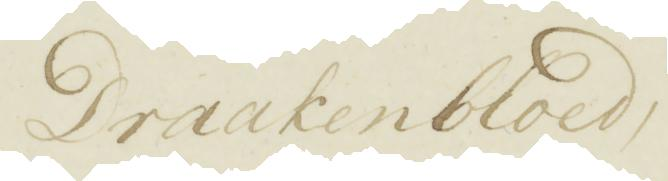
Draakenbloed,
